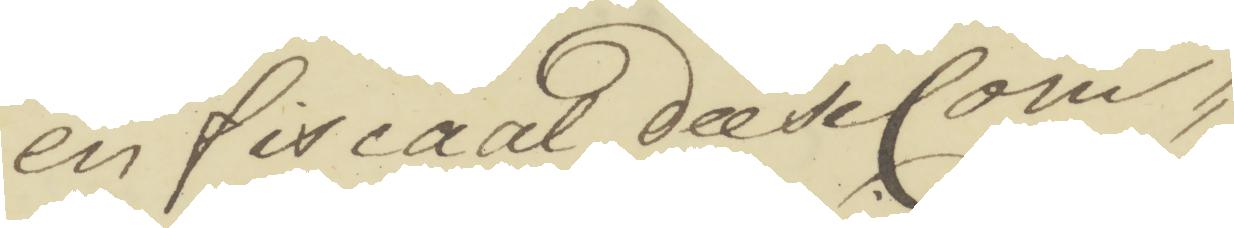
en fiscaal deese Com„
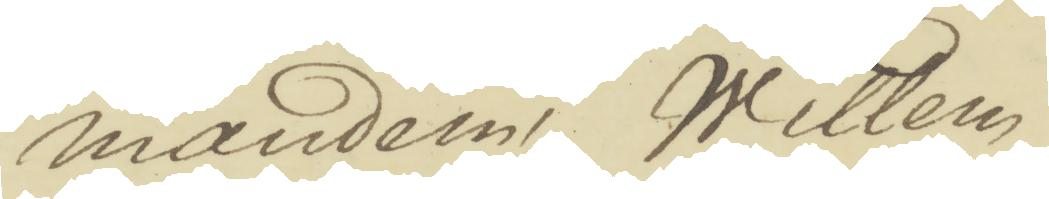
mandem„ts Willem
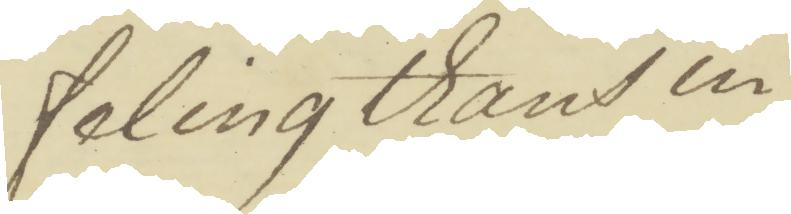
feling thans in
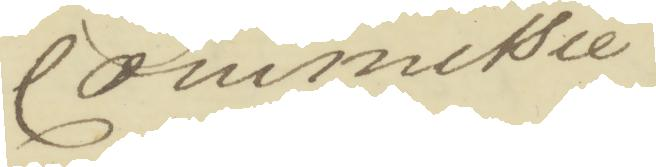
Commissie
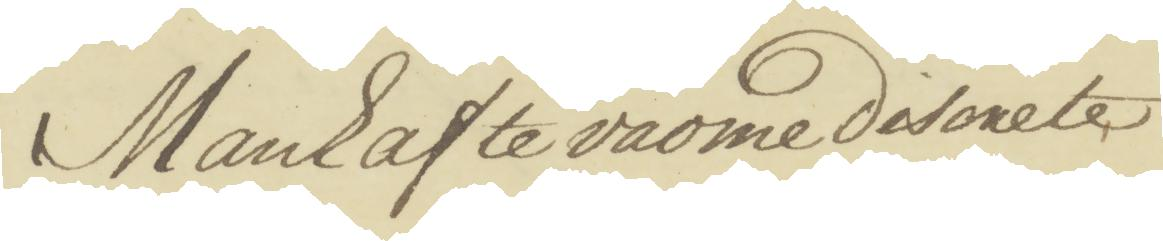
Manhafte vrome discrete
